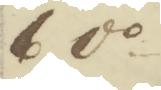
6 d.o
